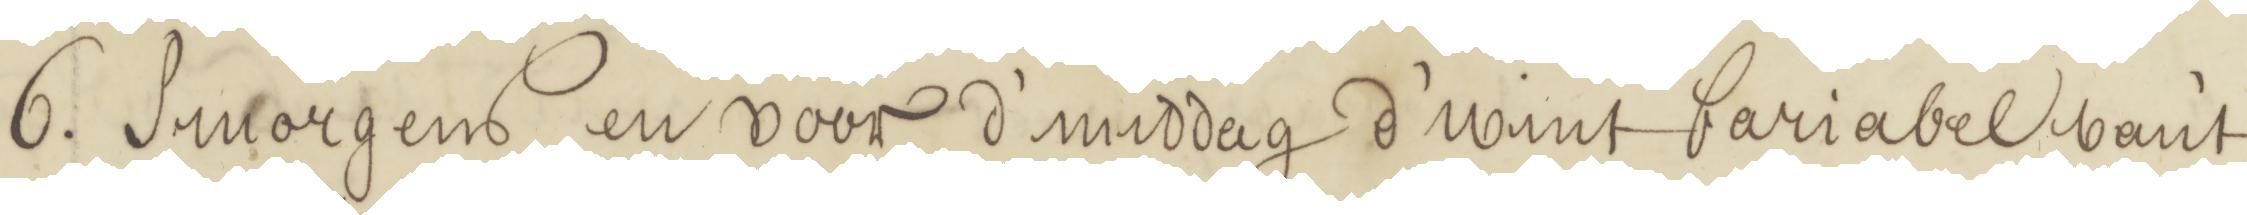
6: Smorgens en voor d’ middag d’ wint fariabel van ’t
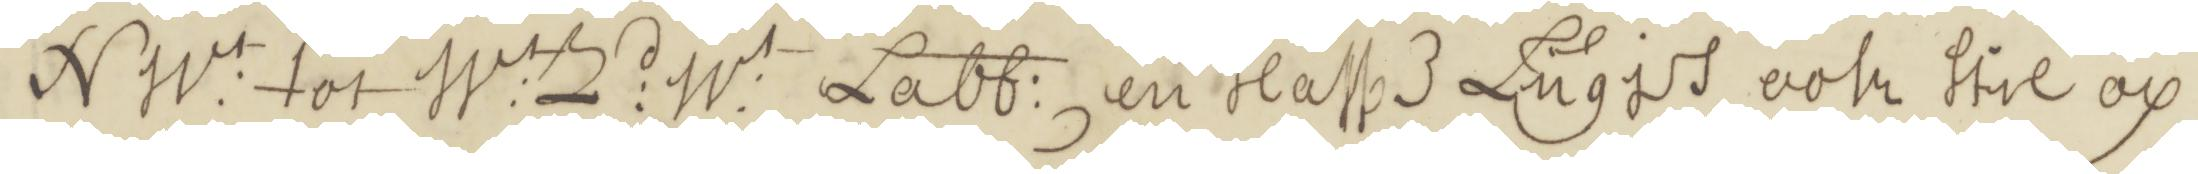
NW:t tot W:t Z:d W:t Labb: en slappe Lugjes ook stil op
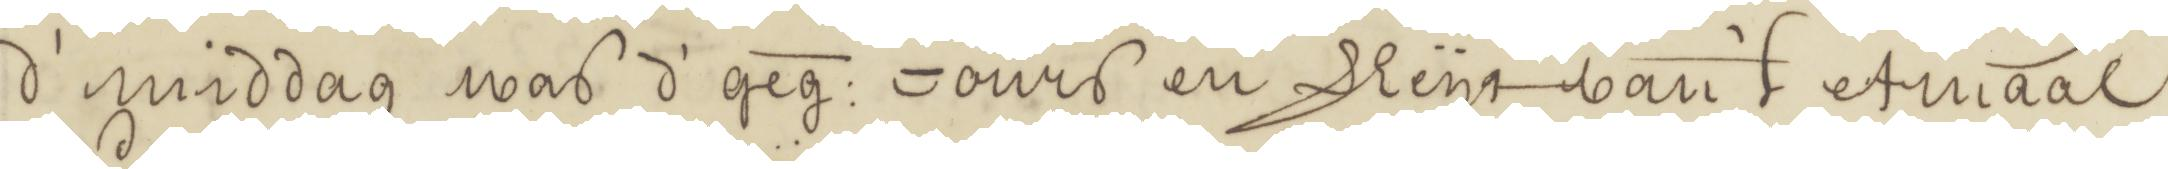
d’ middag was d’ geg: cours en verheijt van ’t etmaal
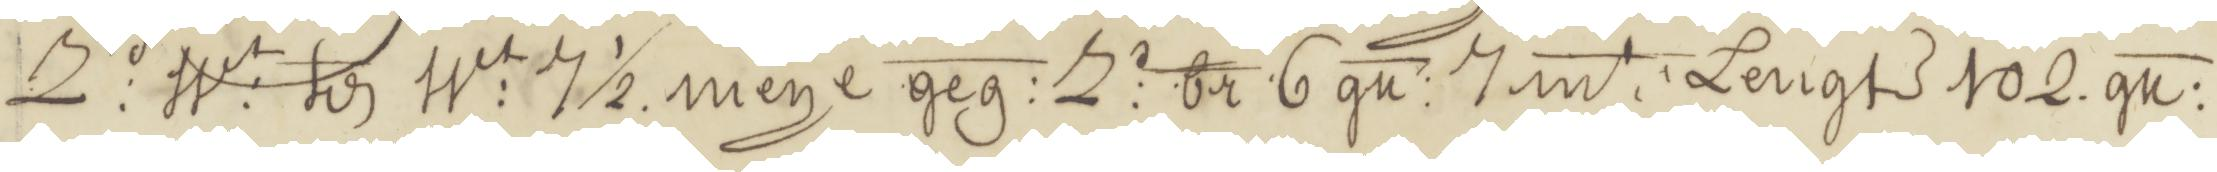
Z:d W:t ten W:t 7/½ meije geg: Z:d br: 6 gr: 7 m:t Lengte 102. gr:
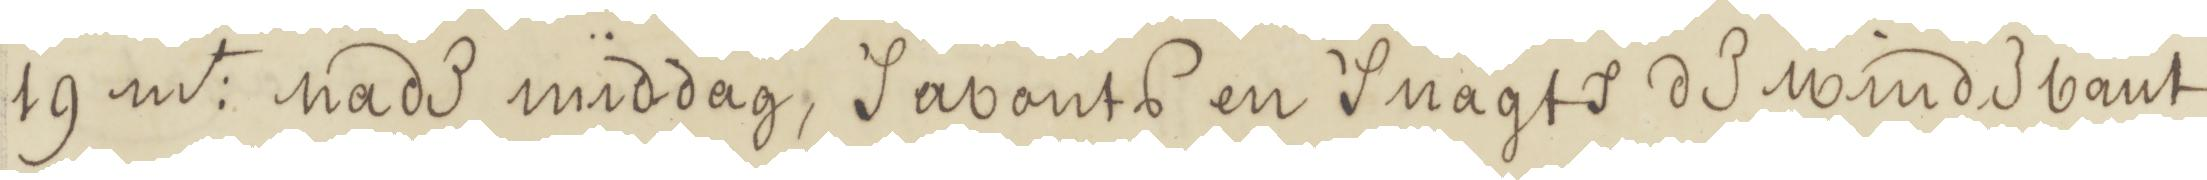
19 m:t nade middag, 's avonts en 's nagts de winde van't
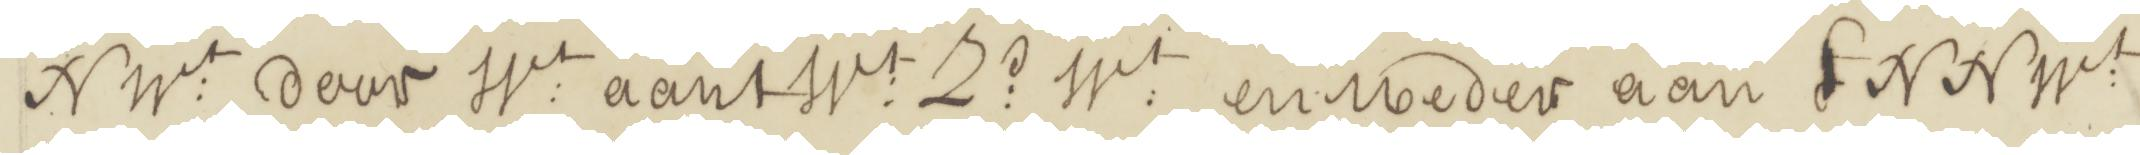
NW:t door W:t aan't W:t Z:d W:t en weder aan t N NW:t
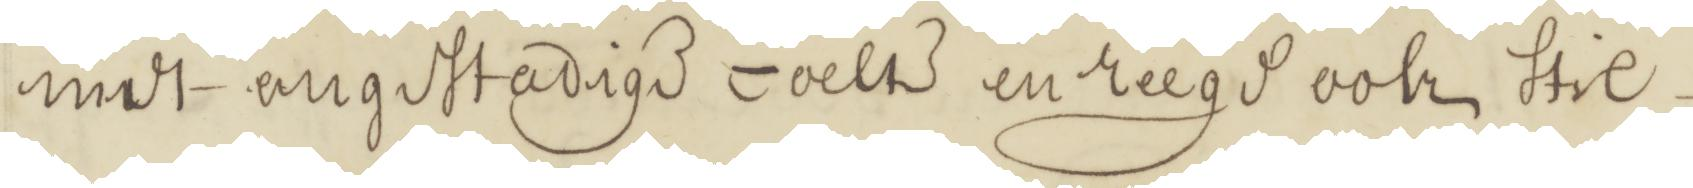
met ongestadige coelte en reege ook stil
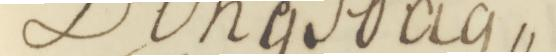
Dingsdag„
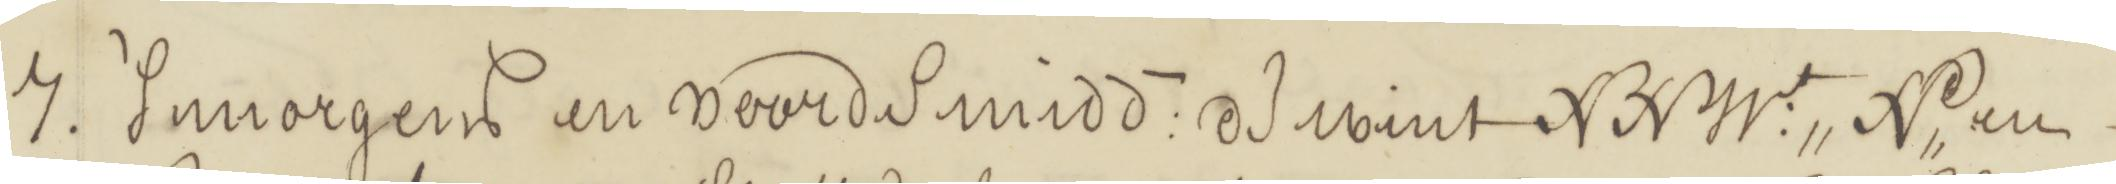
7. 'S morgens en voorde midd: de wint NNW:t„ N„d en
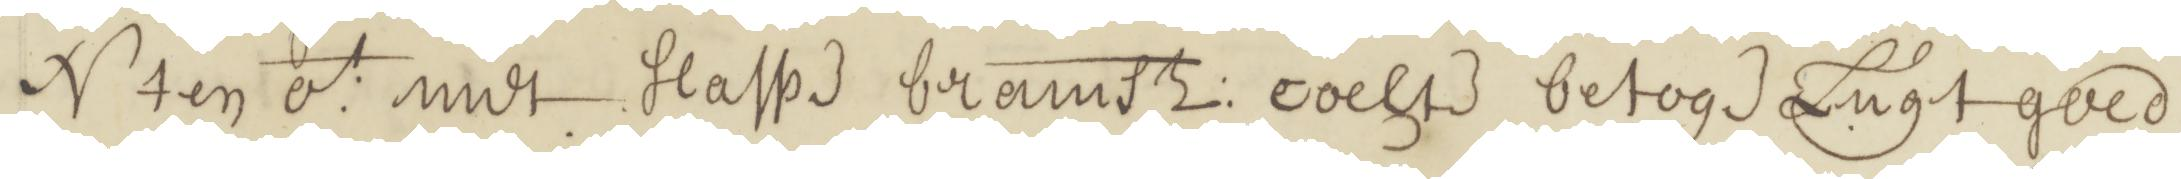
N ten o:t met slappe bramsz: coelte betoge Lugt goed
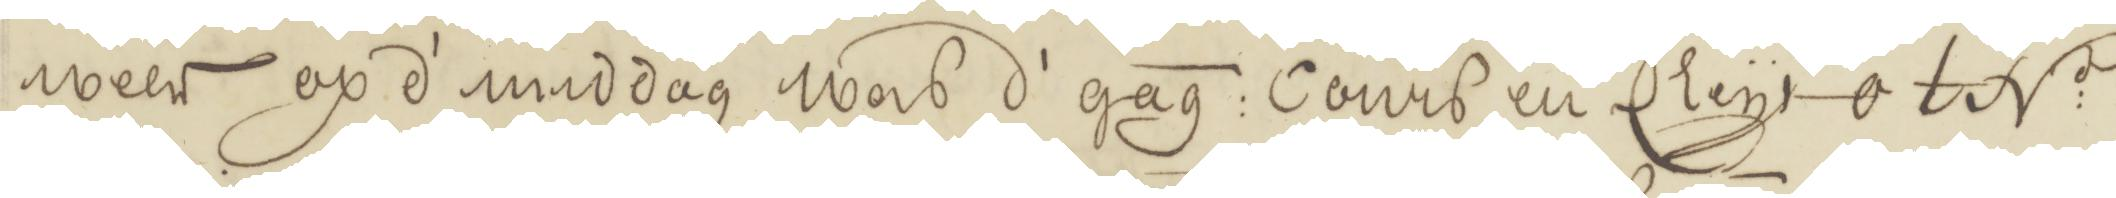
weer op d’ middag was d’ gag: cours en verheijt ot N:d
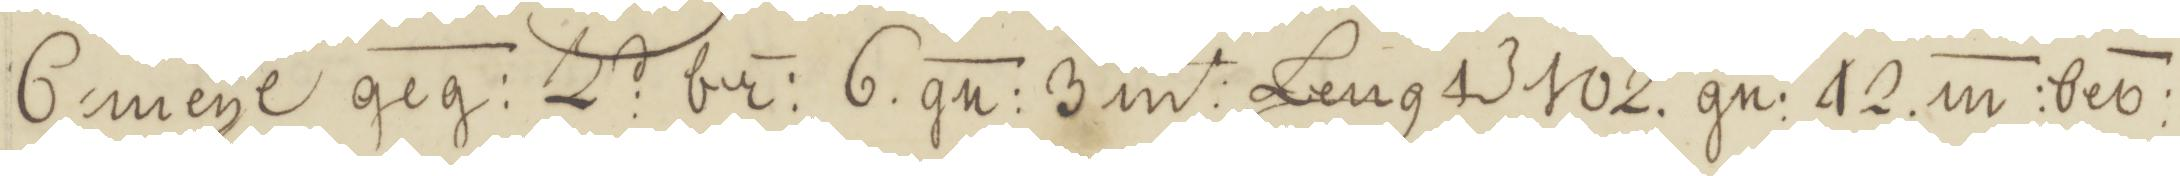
6 meijl geg: Z:d br: 6. gr: 3 m:t Lengte 102. gr: 42. m: bev
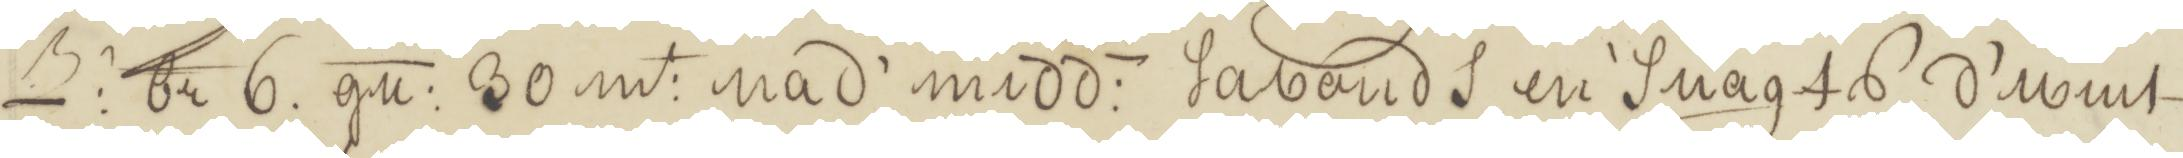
Z:d br 6. gr: 30 m:t na d’ midd: savonds en 'snagts d’wint
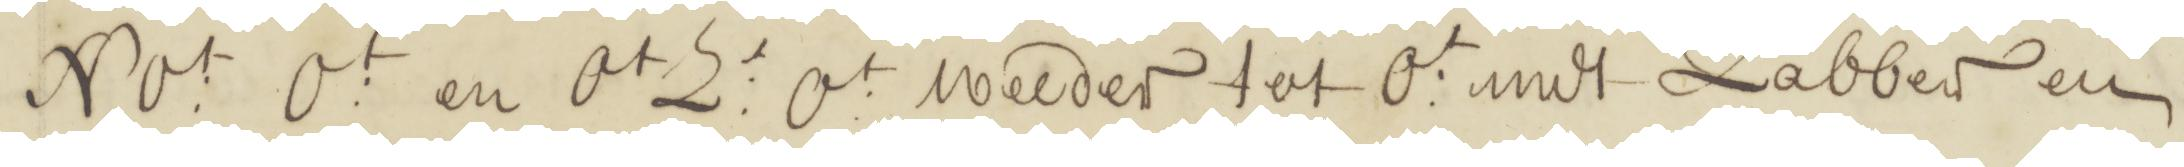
NO:t O:t en O:t Z:t O:t weeder tot O:t met Labber en
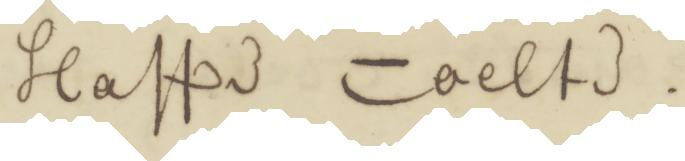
slappe coelte
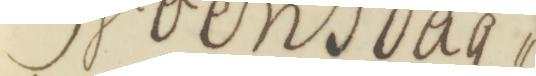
Woensdag „
